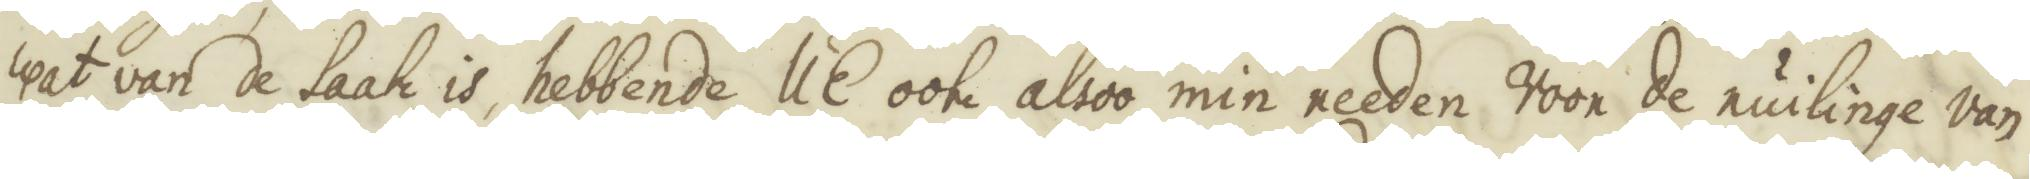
wat van de saak is, hebbende UE ook alsoo min reeden voor de ruilinge van
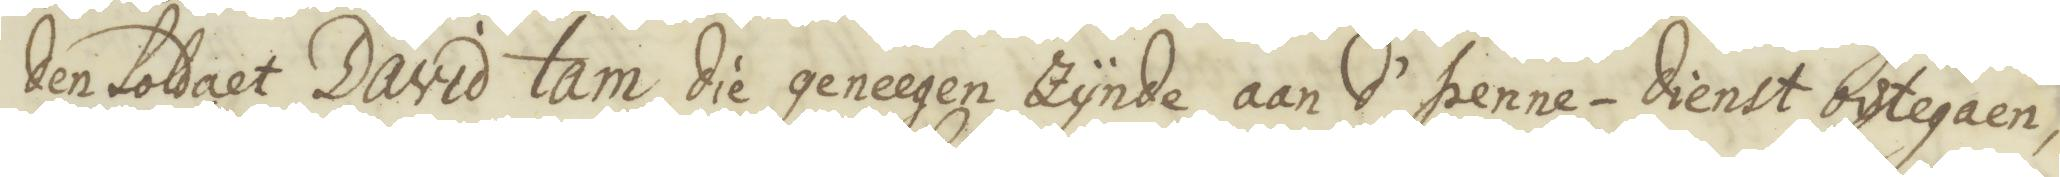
den soldaet David tam, die geneegen zijnde aan d’ penne-dienst overtegaen,
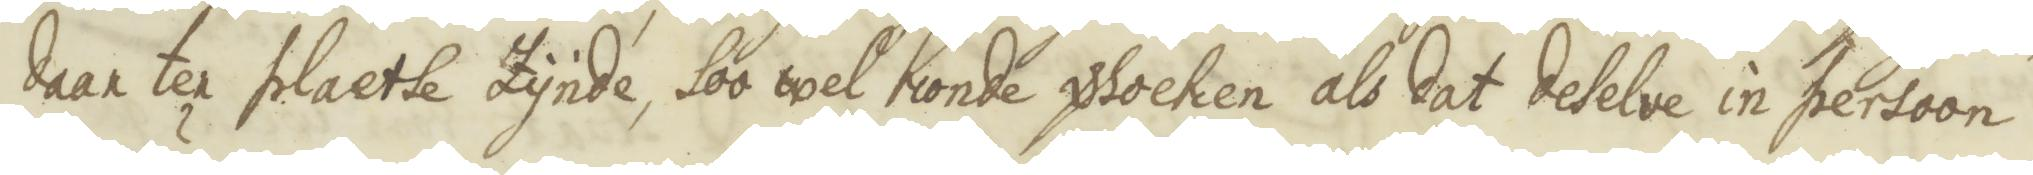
daar ter plaetse zijnde, soo wel konde versoeken als dat deselve in persoon
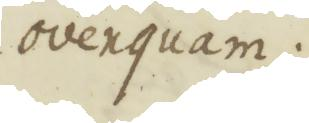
overquam:
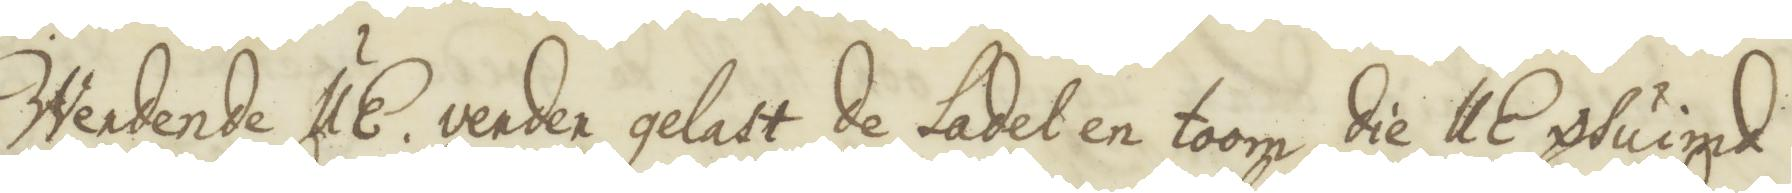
werdende UE. verder gelast de sadel en toom die UE versuimd
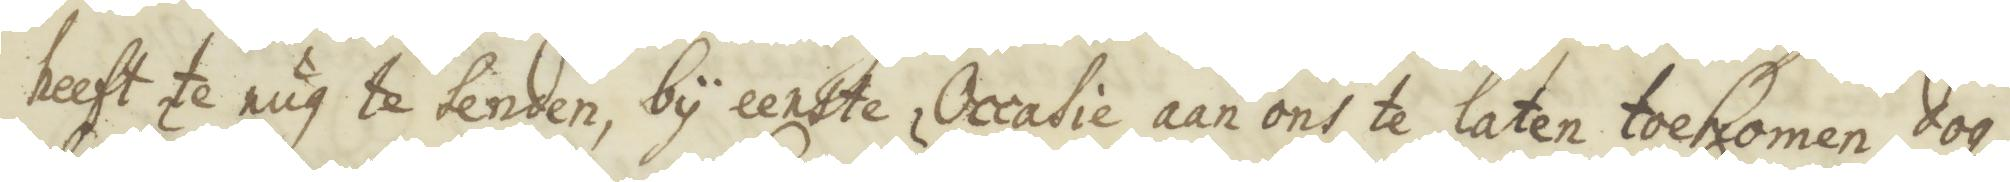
heeft te rug te senden, bij eerste Occasie aan ons te laten toekomen, dog
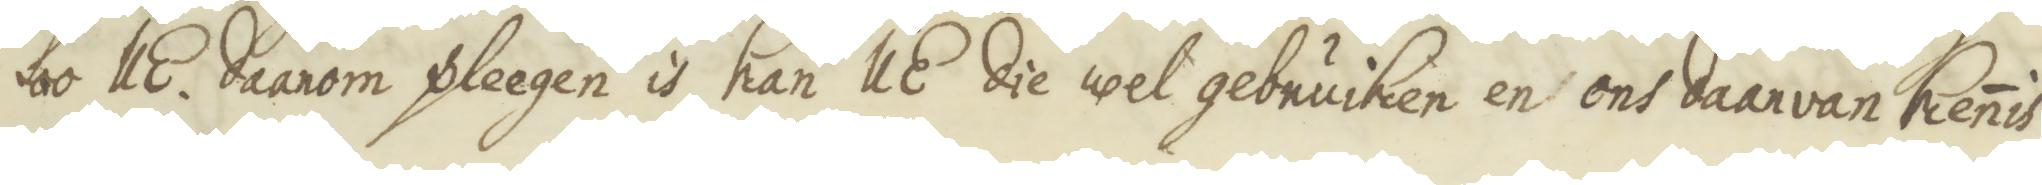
soo UE. daarom verleegen is, kan UE die wel gebruiken en ons daar van kenis
